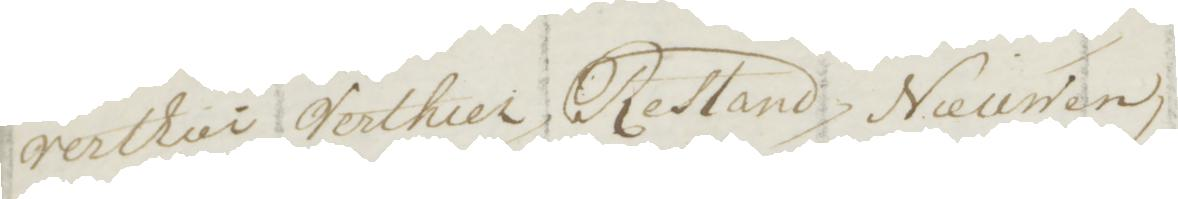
verthier verthier Restand Nieuwen
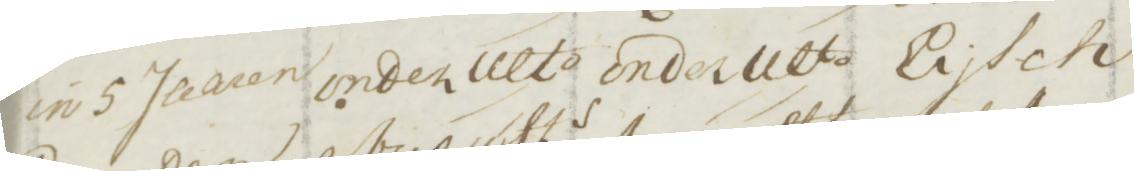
in 5 Jaaren onder ulto onder ulto Eijsch
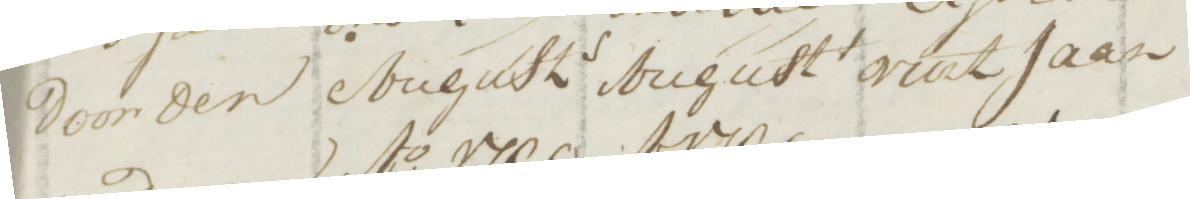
door den Augusts Augusts voort Jaar
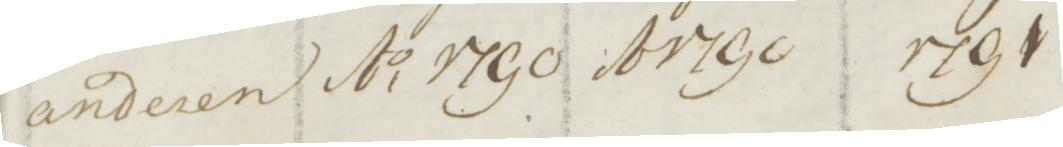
anderen A,o 1790 A 1790 1791
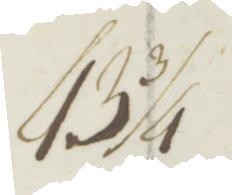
43¾
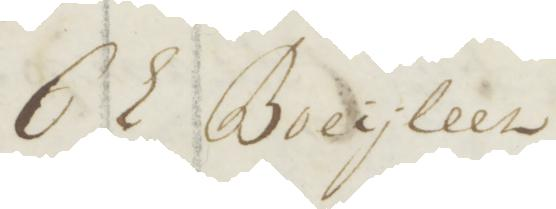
6 h Boeijleer
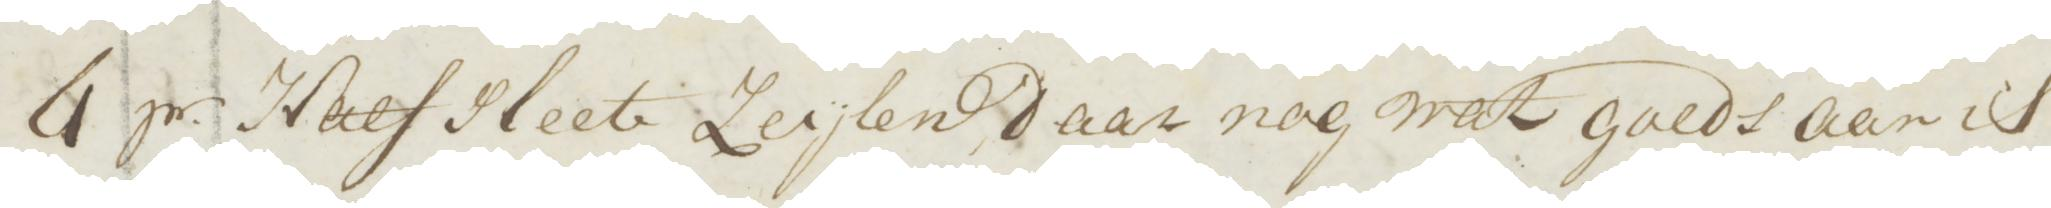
4 pr. Half sleete zeijlen, daar nog wat goeds aan is
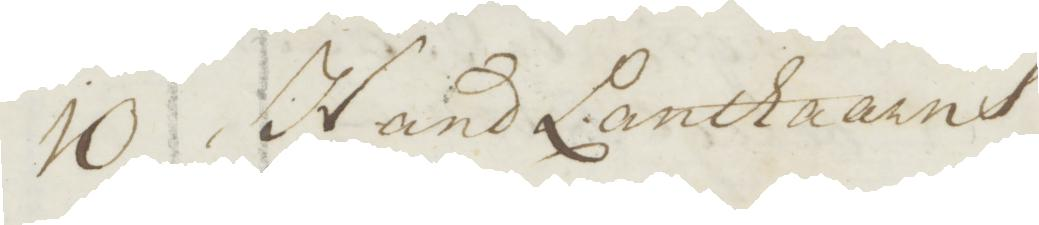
10 , Hand Lanthaarns
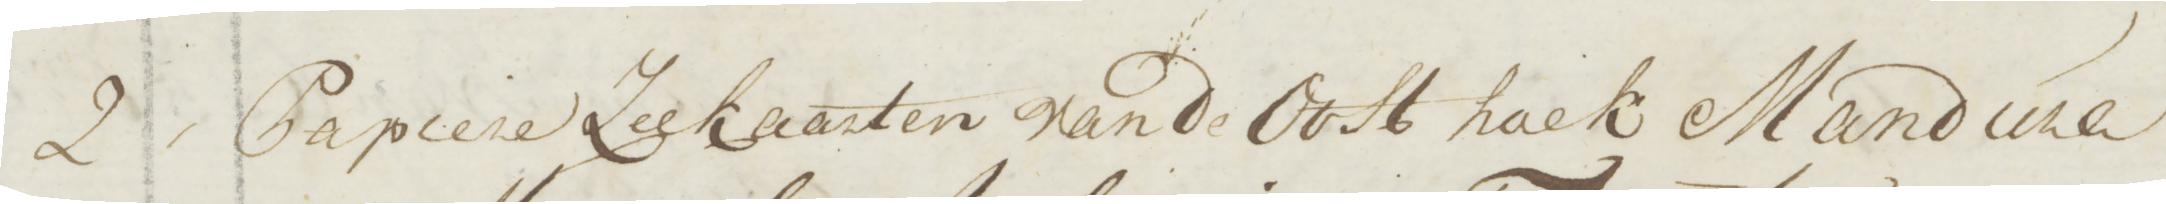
2 , Papiere zeekaarten van de Oost hoek Mandure
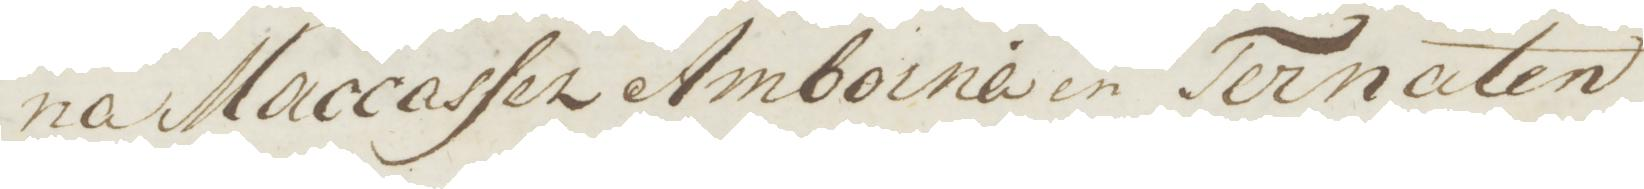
na Maccasser Amboina en Ternaten
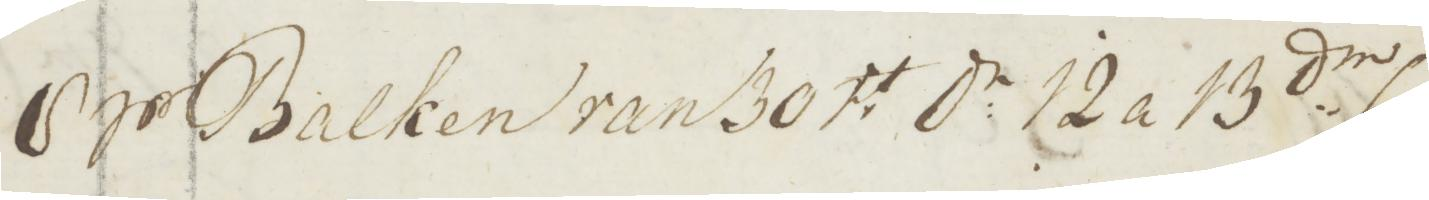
8 pr Balken van 30 v:t d:k 12 a 13: d„m
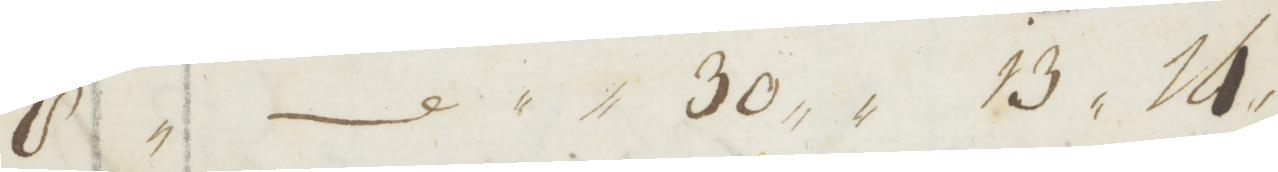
8„ _o „ „ 30 „ „ 13 „ 14 „
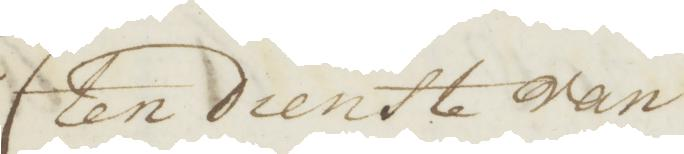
ten dienste van
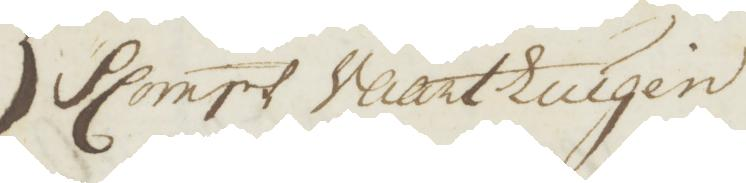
'sComps vaarthuigen
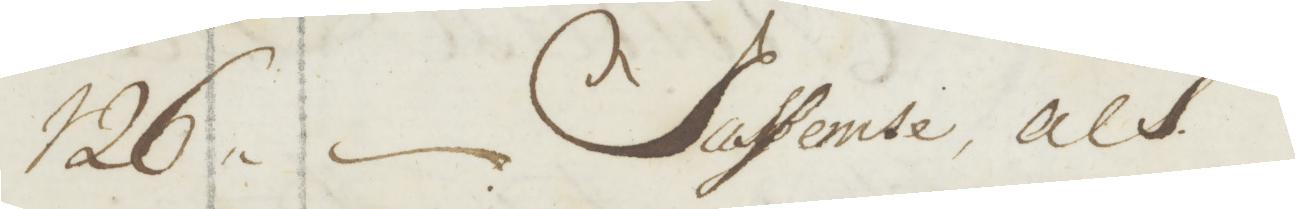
126„ _ Iassemse, als.
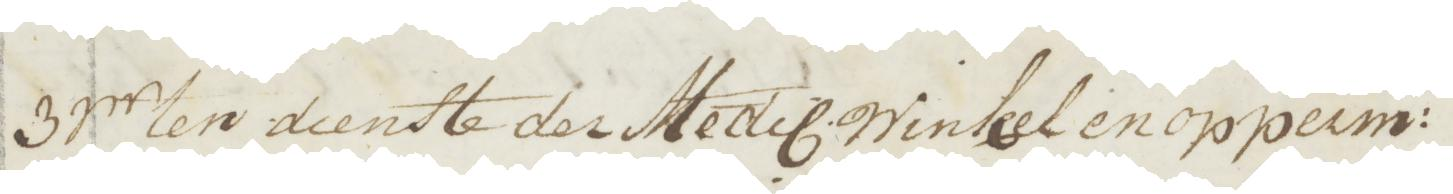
3 pr ten dienste der Medic. winkel en opperm:
